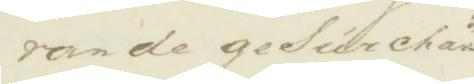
van de gesurchar
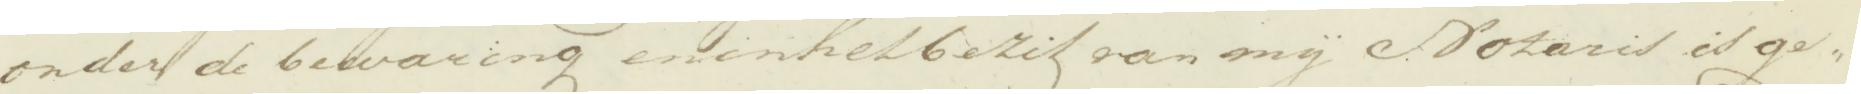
onder de bewaring en in het bezit van mij Notaris is ge„
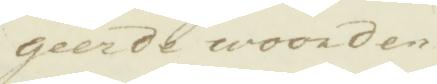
geerde woorden
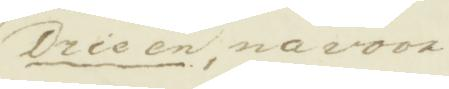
drie en, na voor
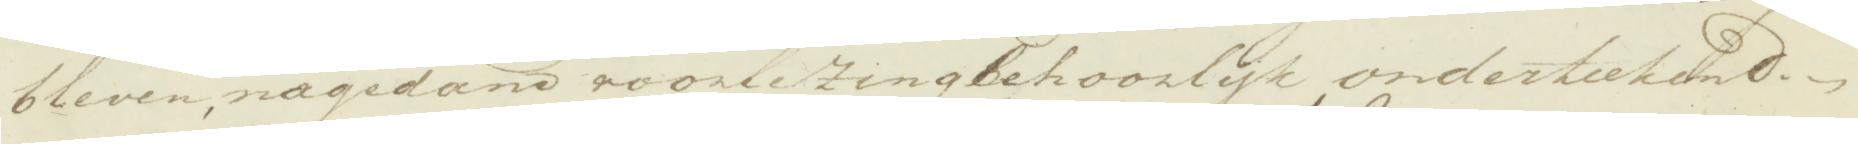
bleven, nagedane voorlezing behoorlijk onderteekend.-
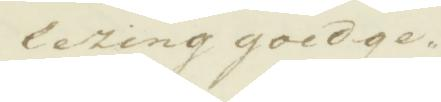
lezing goedge„
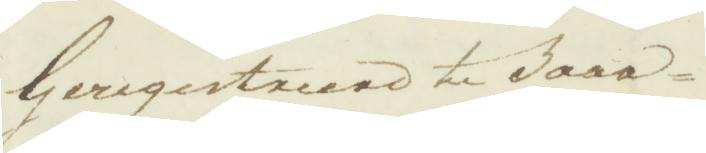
Geregistreerd te Haar=
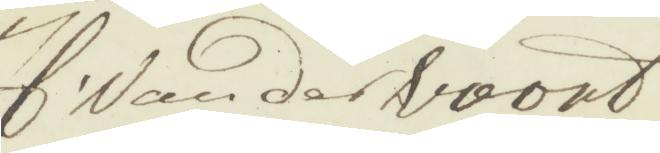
H Van der Voort
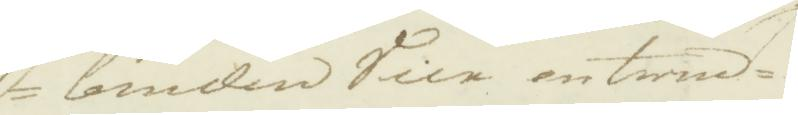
= lemden Vier en twin=
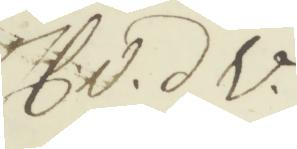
H V d V.
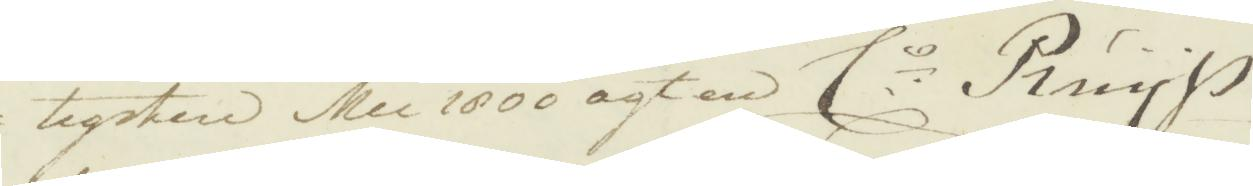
tigsten Mei 1800 agt en C=o Pruijss
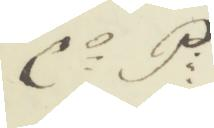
C=o P:
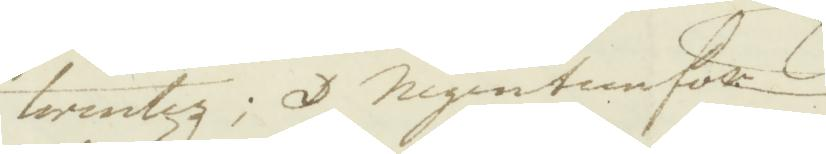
twintig; D negentien fol.
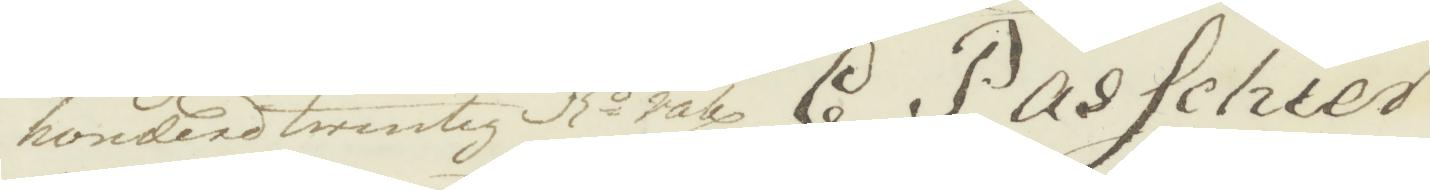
honderd twintig R=o vak C Passchier
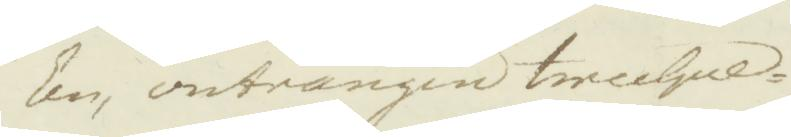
Een, ontvangen twee Gul=
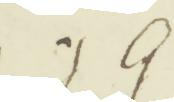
J J G
